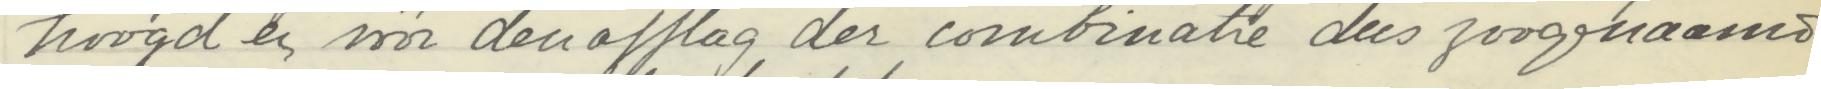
hoogd en voor den afslag der combinatie dus zoogenaamd
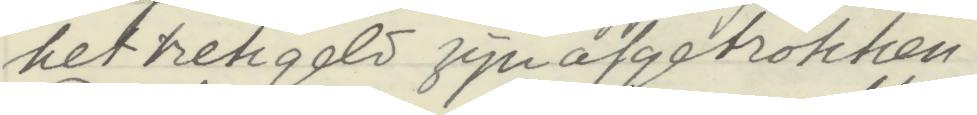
het trekgeld zijn afgetrokken
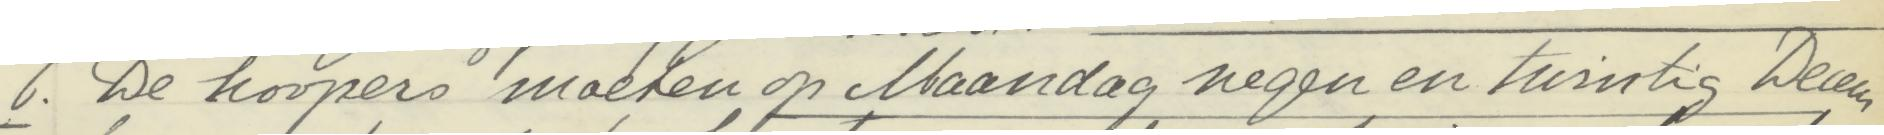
6. De koopers moeten op Maandag negen en twintig Decem
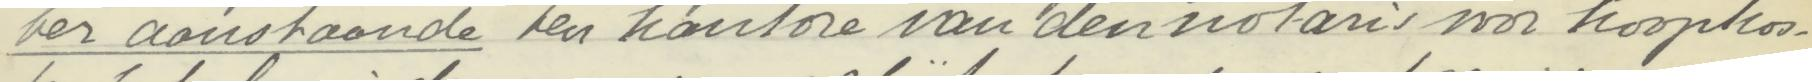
ber aanstaande ten kantore van den notaris voor koopkos-
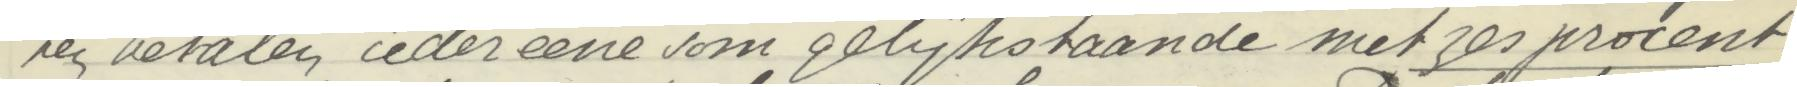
ten betalen ieder eene som gelijkstaande met zes procent
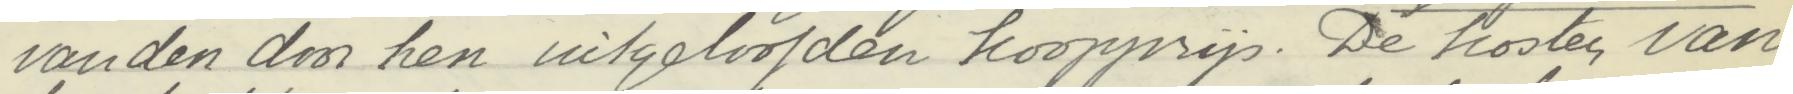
van den door hen uitgeloofden koopprijs. De kosten van
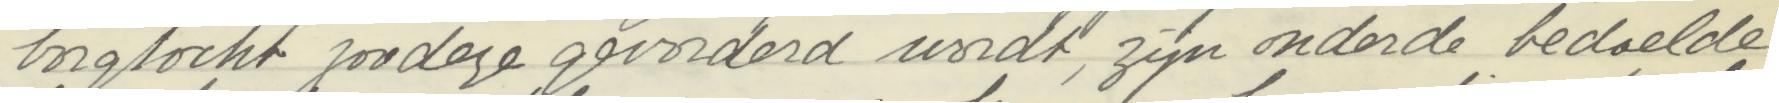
borgtocht zoo deze gevorded wordt, zijn onder de bedoelde
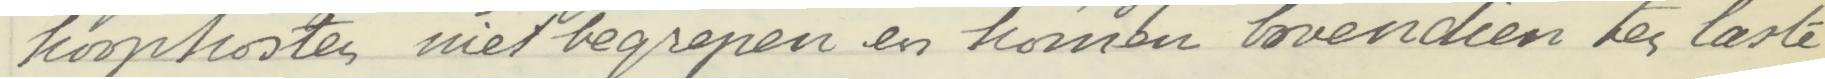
koopkosten niet begrepen en komen bovendien ten laste
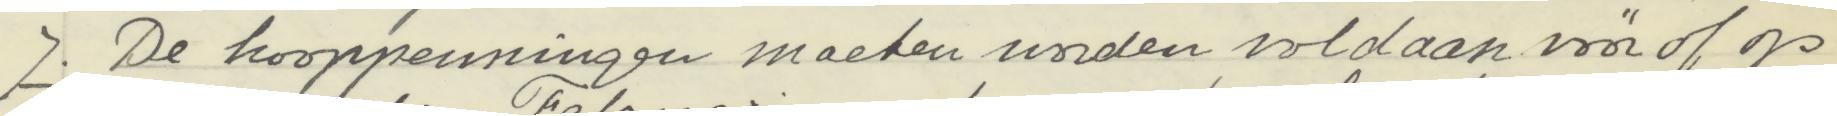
7. De kooppenningen moeten worden voldaan vóór of op
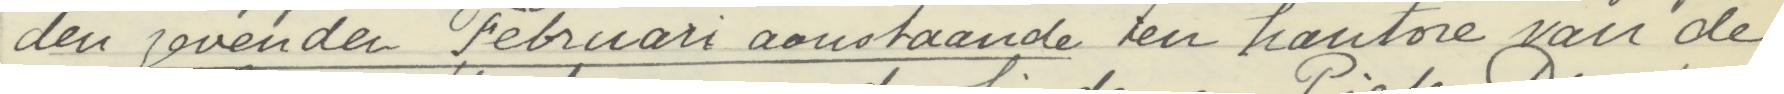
den zevenden Februari aanstaande ten kantore van de
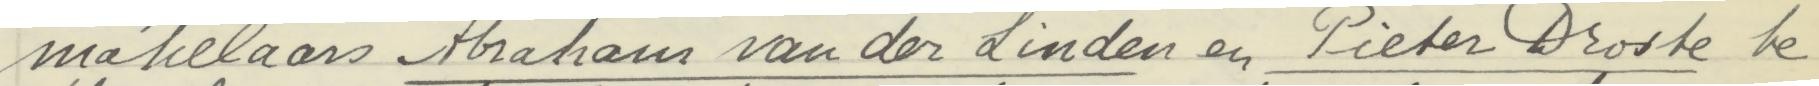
makelaars Abraham van der Linden en Pieter Droste te
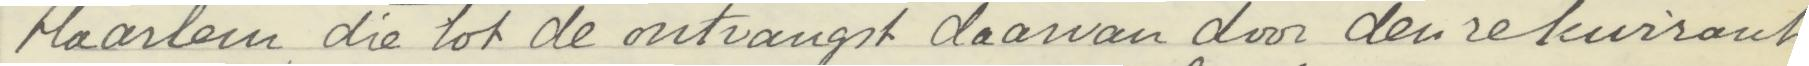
Haarlem, die tot de ontvangst daarvan door den rekwirant
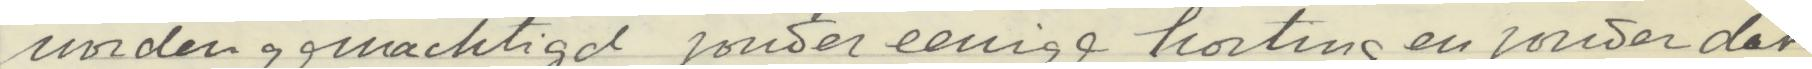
worden gemachtigd zonder eenige korting en zonder dat
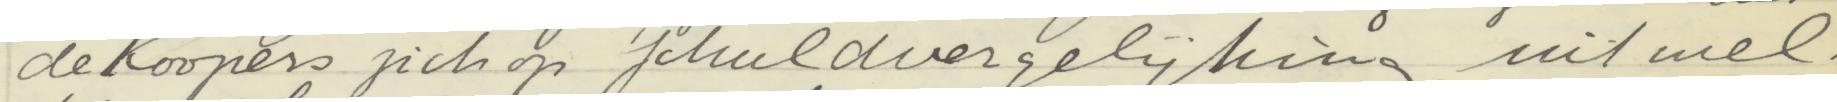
de koopers zich op schuldvergelijking uit wel
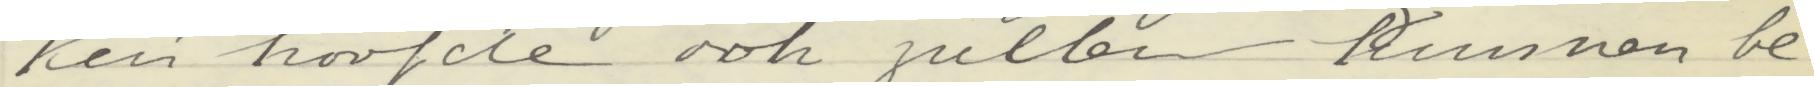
ken hoofde ook zullen kunnen be
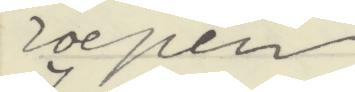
roepen
